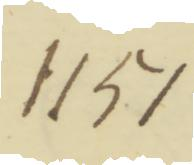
1151
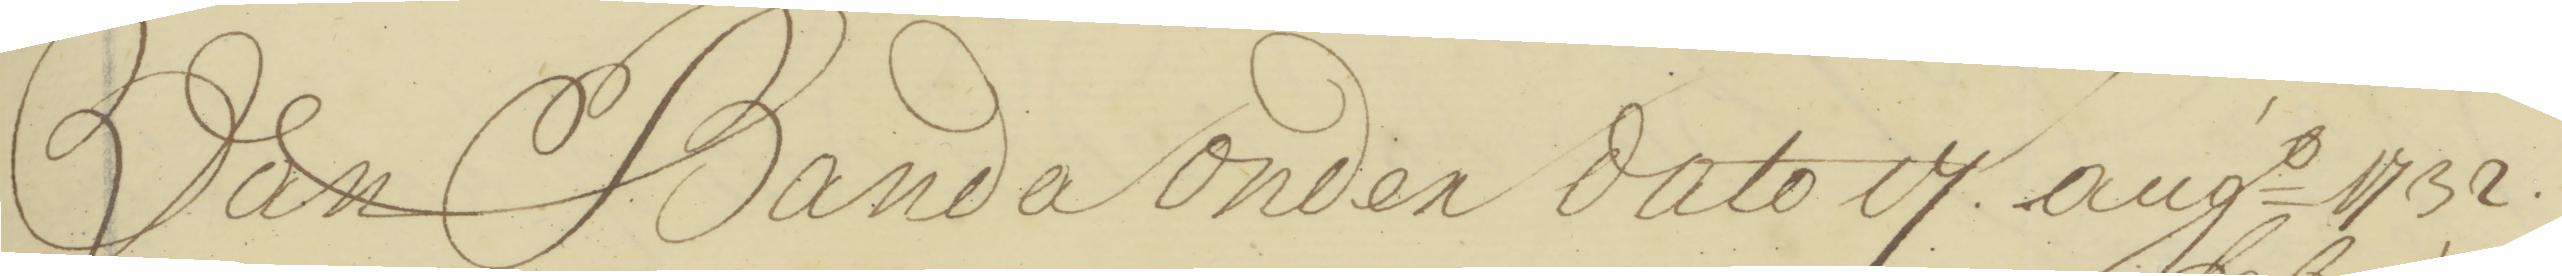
Van Banda onder dato 17.' aug=s 1732.
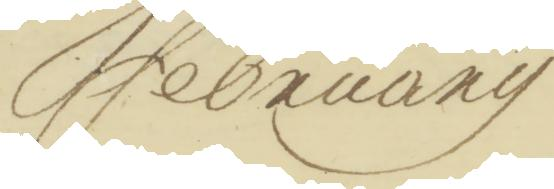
februarij
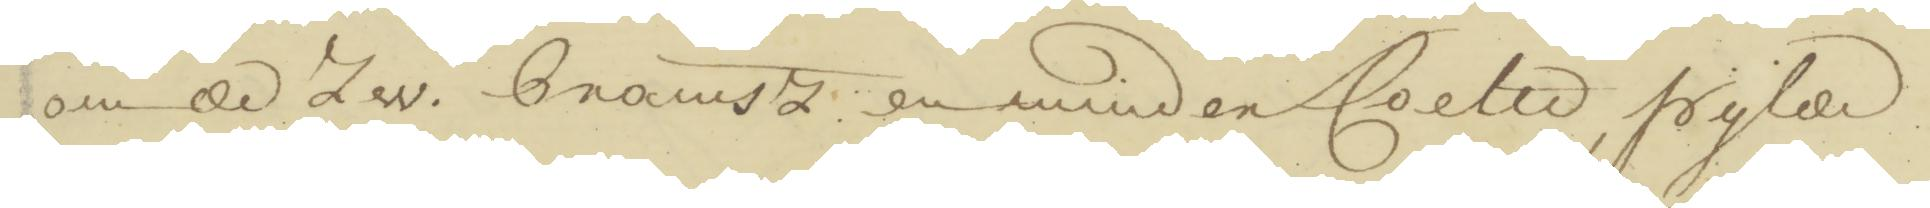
om de Zw. bramsz: en minder Coelte, pijlde
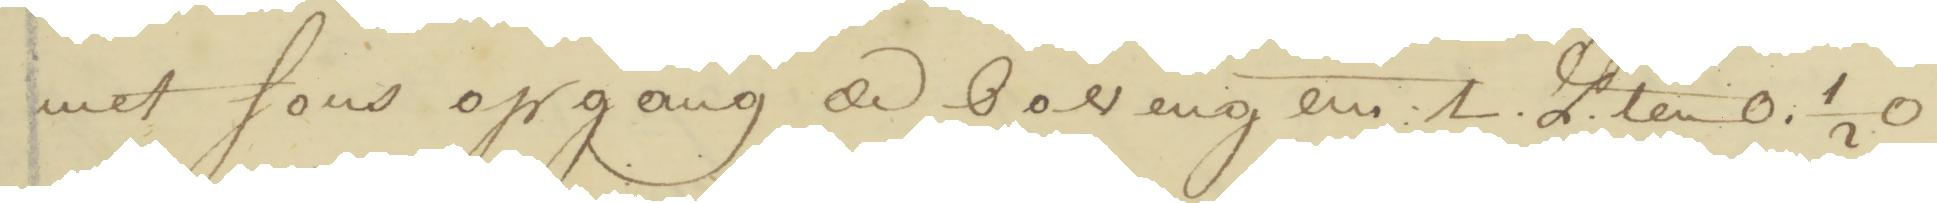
met Sons opgang de boven gem: L. Z. ten o. ½ o.
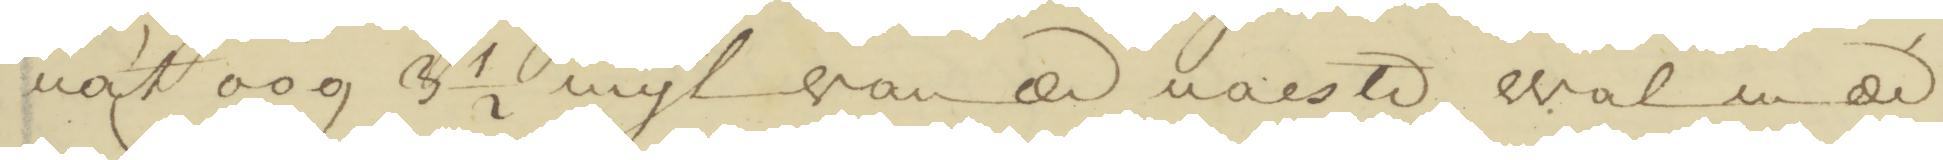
na 't oog 3½ mijl van de naeste wal in de
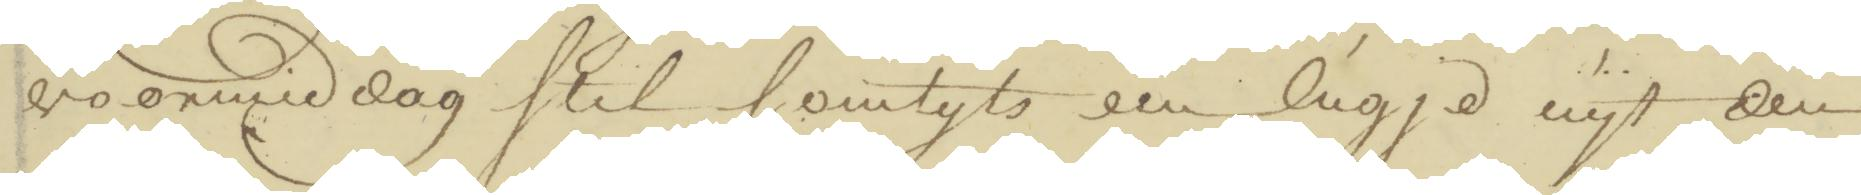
voormiddag stil, Somtyts een lugje uijt den
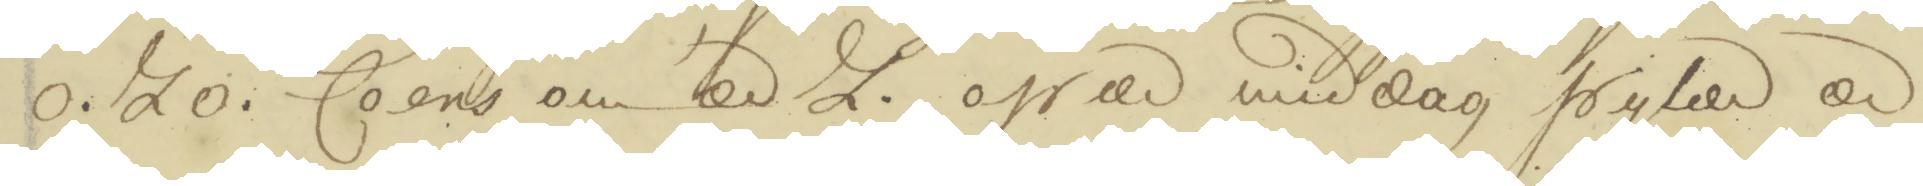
o. Zo: Coers om de Z., op de middag pijlde de
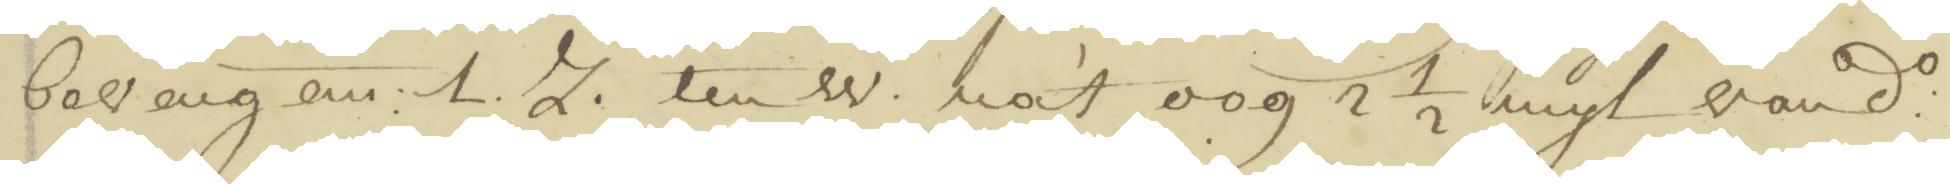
boven gem: L. Z. ten W. na 't oog 2½ mijl van d:o
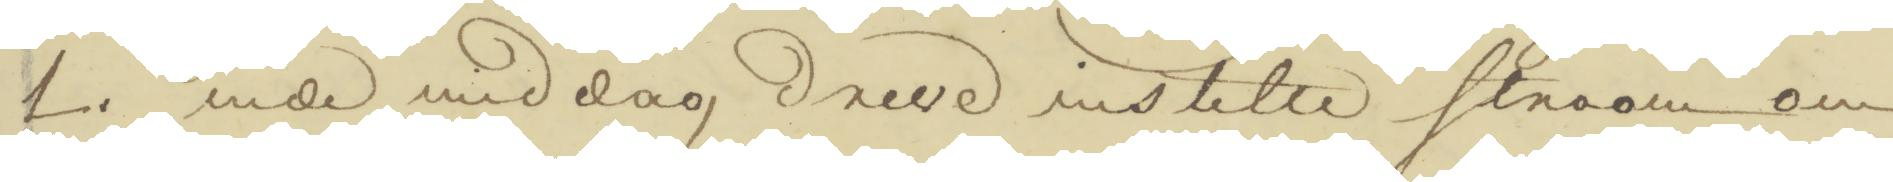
L., inde middag dreve instilte Stroom om
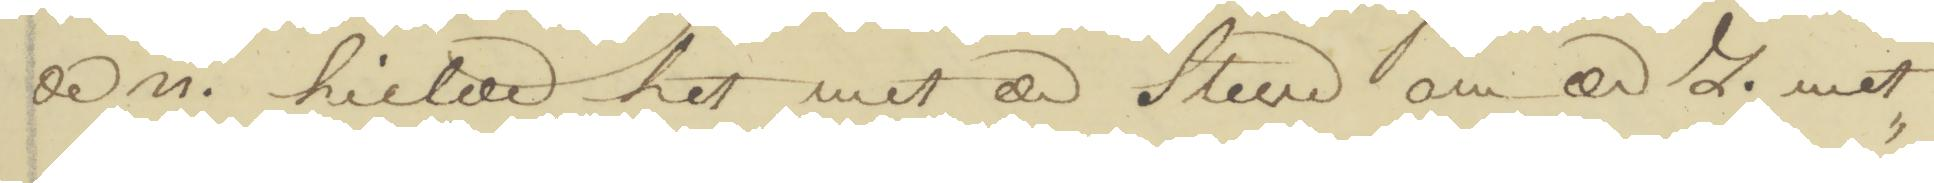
de n. hielde het met de Steve om de Z. met„
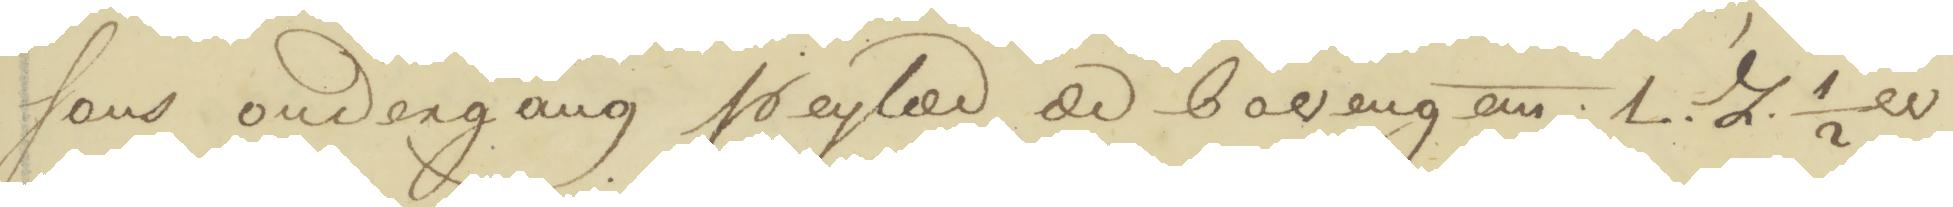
Sons ondergang peylde de boven gem: L: Z. ½ w
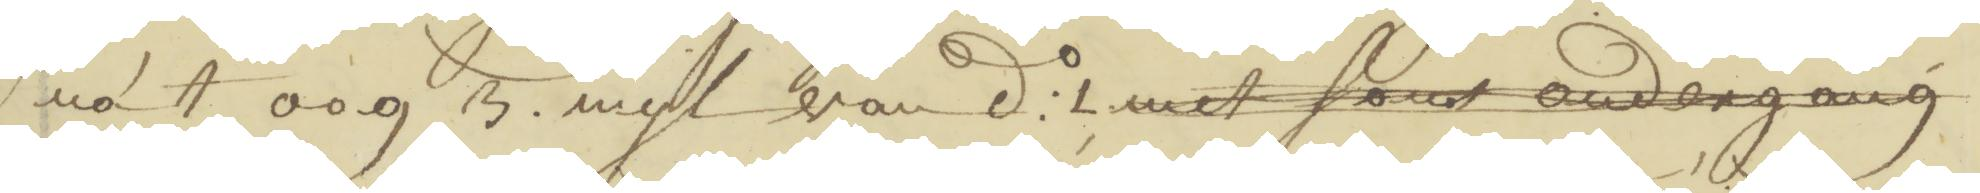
na 't oog 3. mijl van d:o L, met sons ondergang
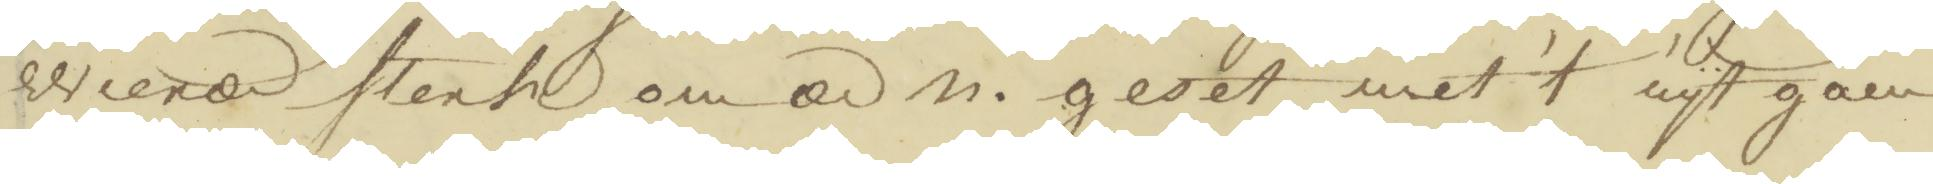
wierde Sterk om de n.' geset, met ’t uijt gaen
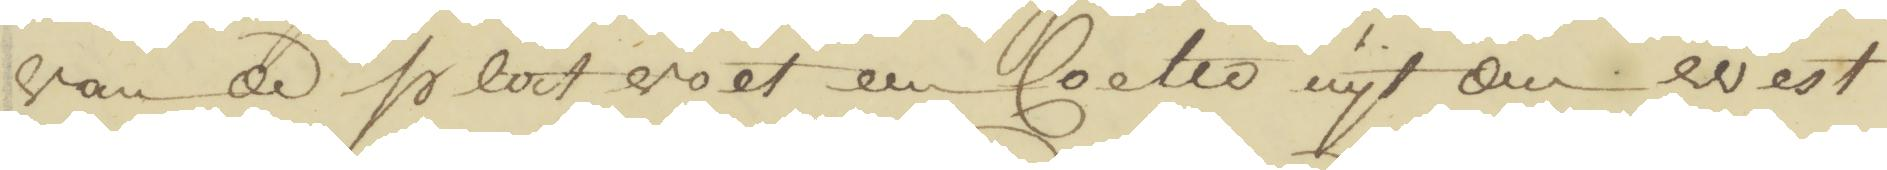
van de plat voet een Coelte uijt den west
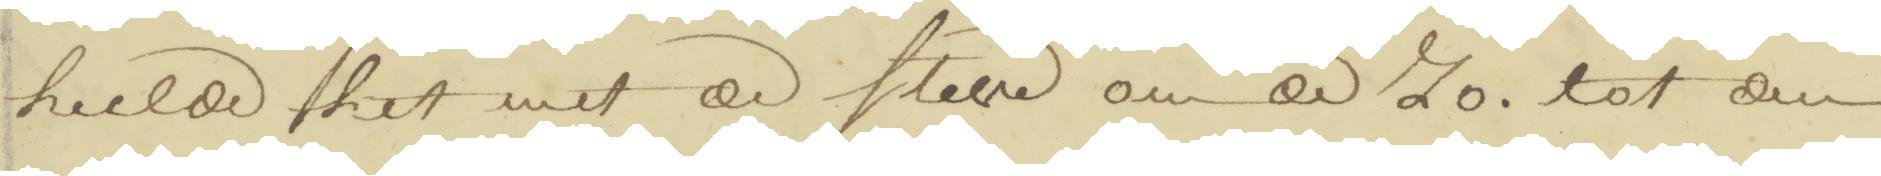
hielde het met de steve om de Zo. tot den
